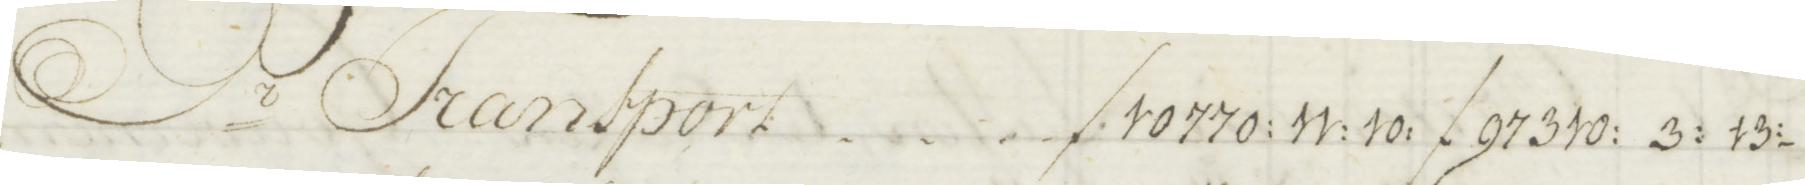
P=r Transport . . . . ƒ 10770: 11: 10: ƒ 97310: 3: 13:-
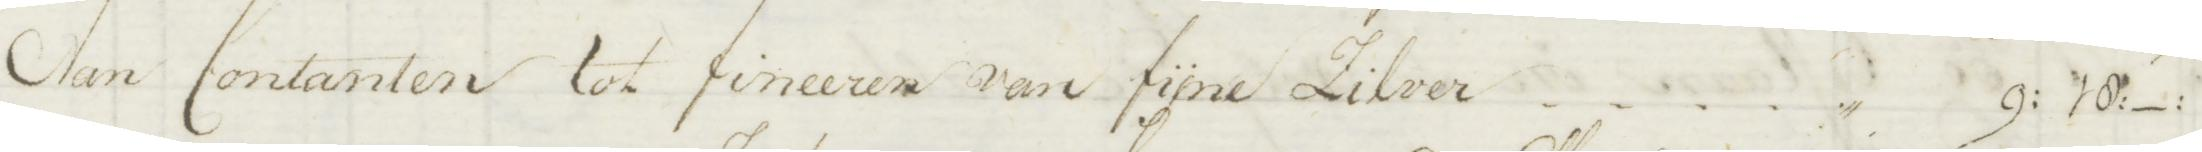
Aan Contanten tot fineeren van fijne zilver . . . . .„ 9: 18: — :
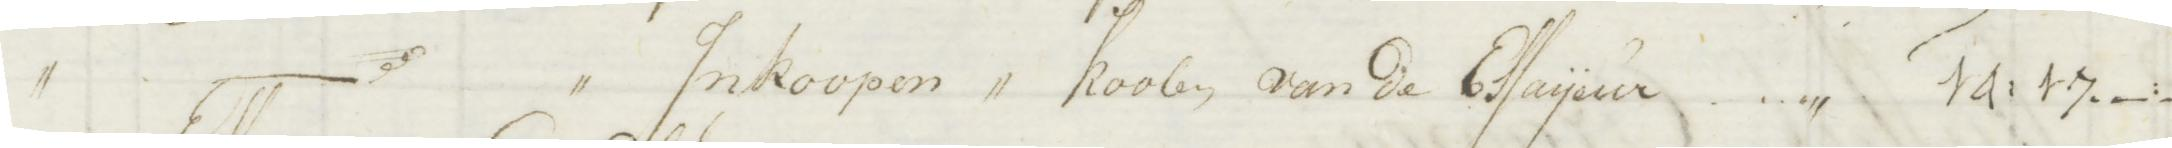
„ . _o „ Jnkoopen „ koolen van de Essaijeur . . . .„ 14: 17.— : -
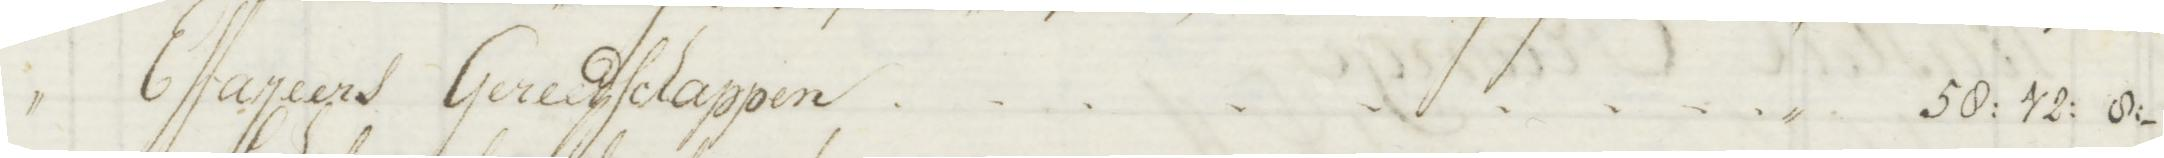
„ Essajeers Gereedschappen . . . . . . . . . „ 58: 12: 8:-
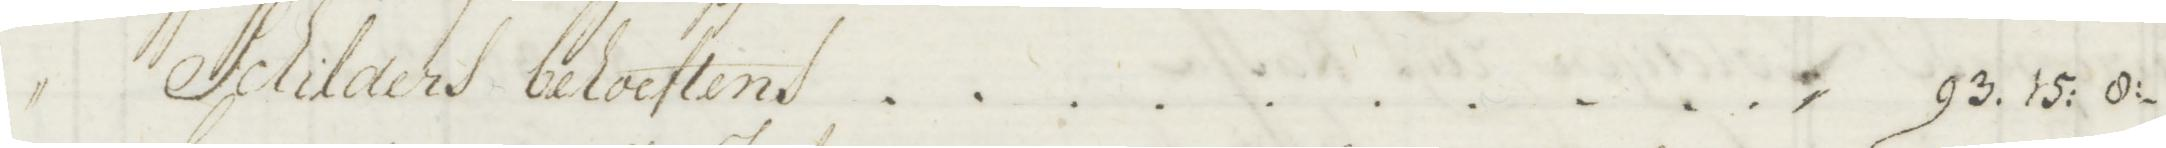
„ Schilders behoeftens . . . . . . . . . . „ 93. 15: 8:-
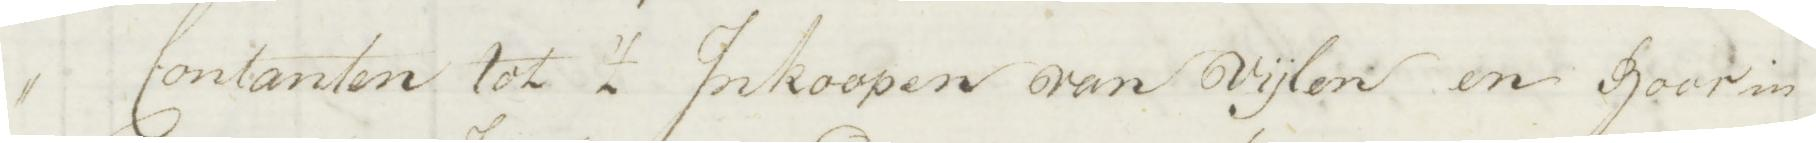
„ contanten tot ’t Jnkoopen van vijlen en Boor in
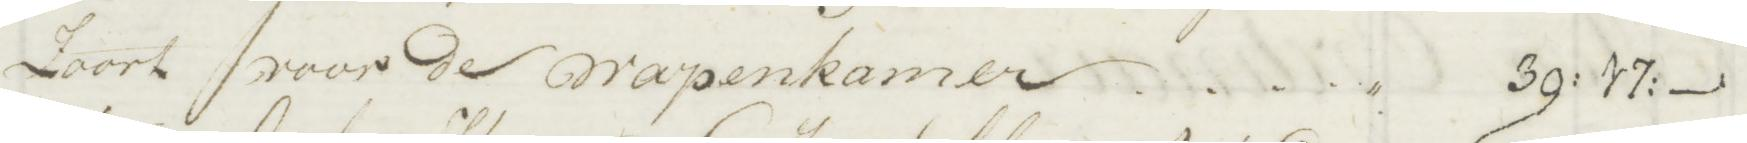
zoort voor de wapenkamer . . . . „ 39:17: —:
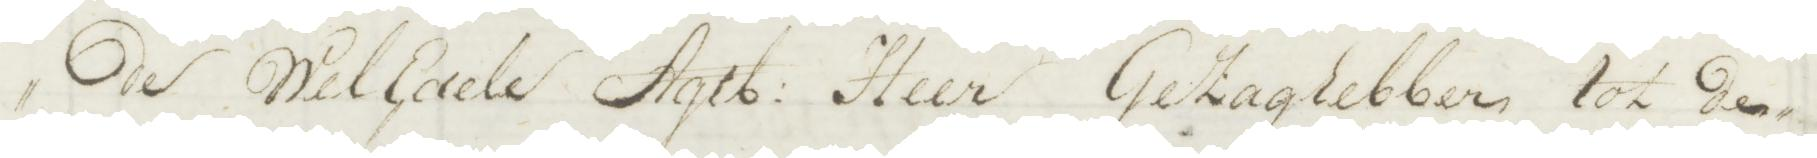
„ de Wel Edele Agtb: Heer Gezaghebber tot de„
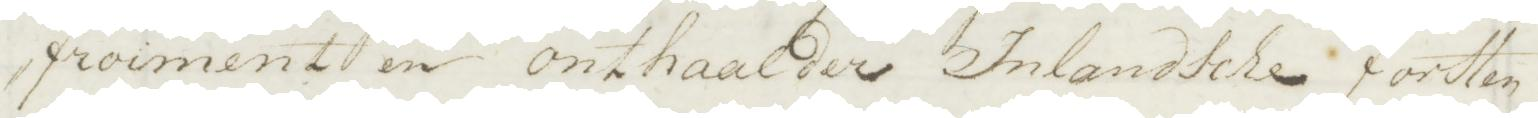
„froiment en onthaalder Inlandsche forsten
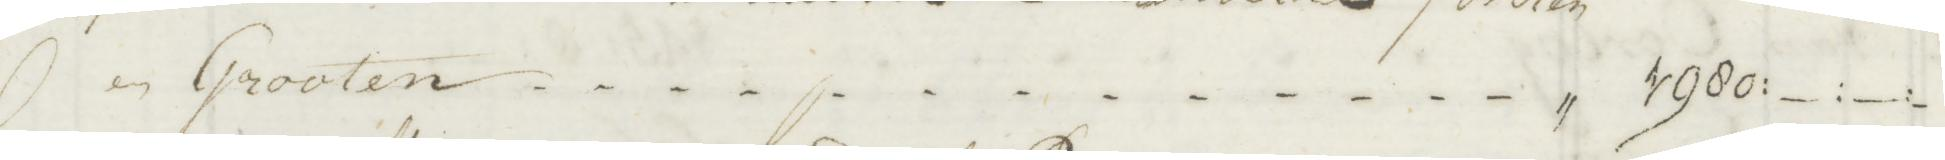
en Grooten - - - - - - - - - - - - - „ 1980: — : — :-
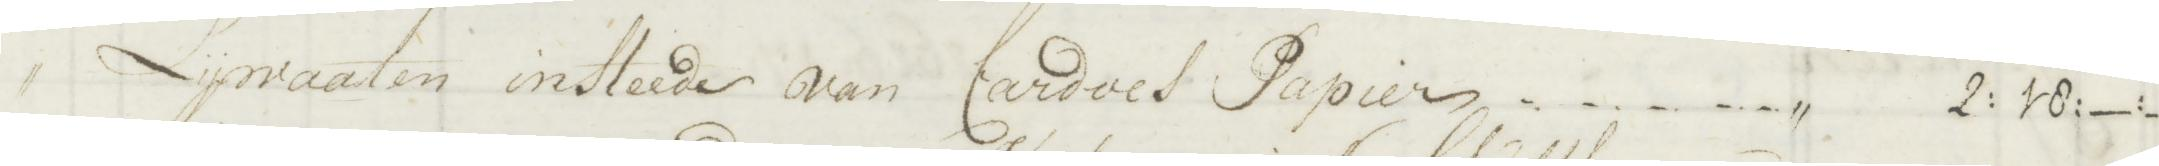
„ Lijwaaten insteede van Cardoes Papier - . - . - . - . - . „ 2: 18: — :
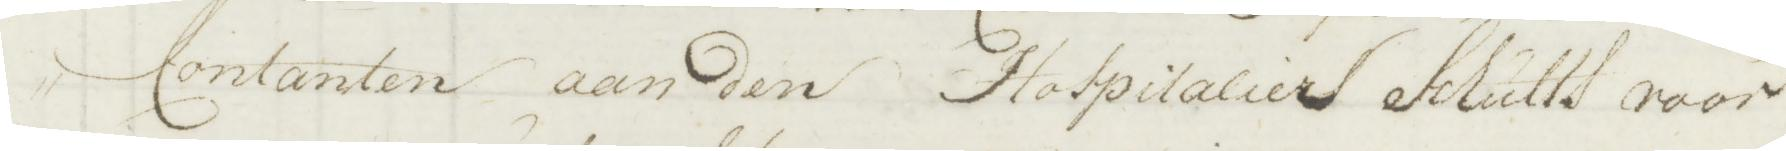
„ Contanten aan den Hospitaliers Schults voor
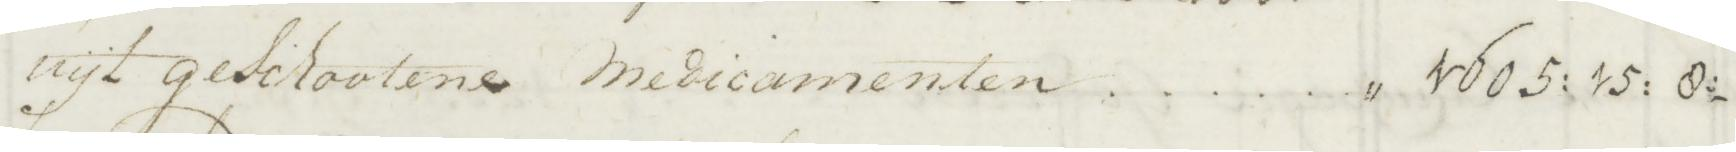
uijt geschootene medicamenten . . . . . . „ 1605: 15: 8:-
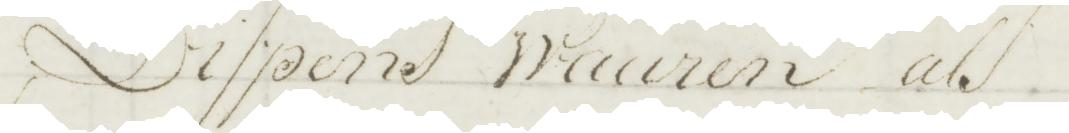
Dispens Waaren als
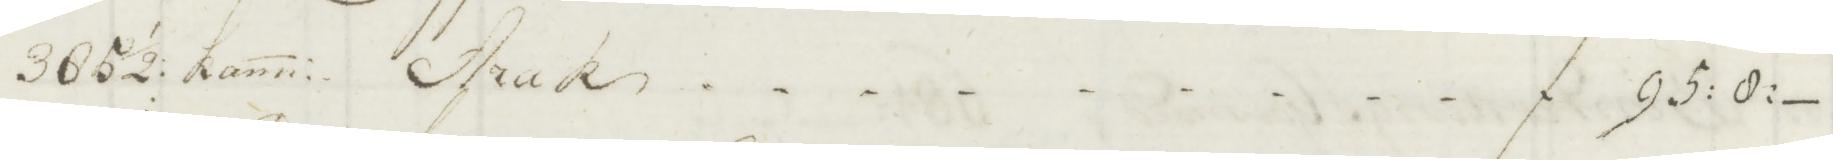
385½: kann: Arak - - - - - - - - - ƒ 95: 8:—
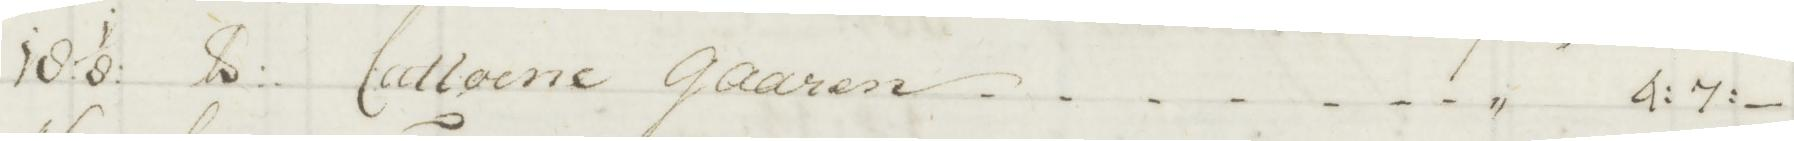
18:1/8: lb: Cattoene gaaren - - - - - - - „ 4: 7: —
